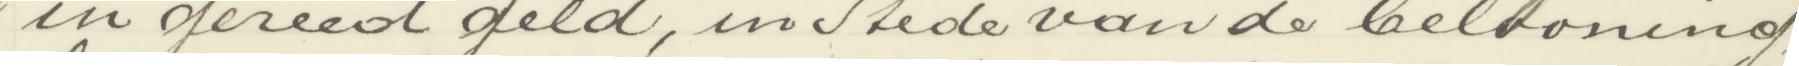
in gereed geld, in Stede van de belooning
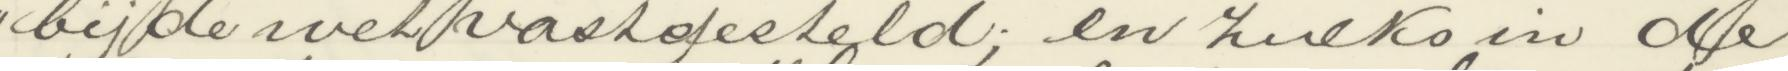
bij de wet vastgesteld; en zulks in de
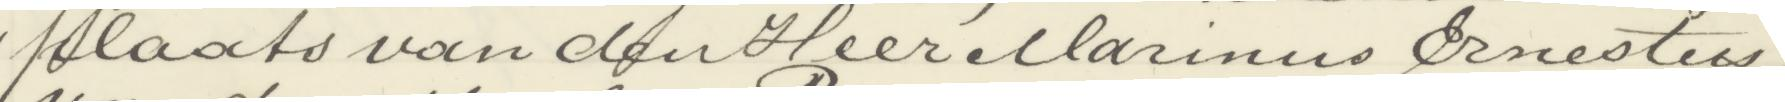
plaats van den Heer Marinus Ernestus
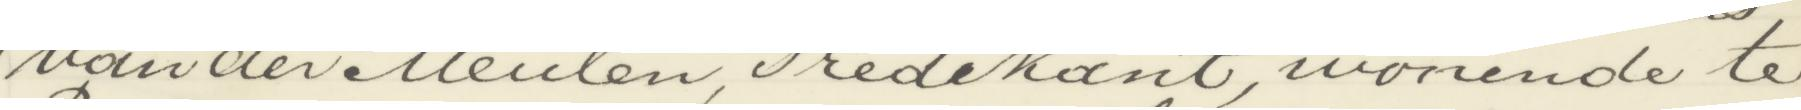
van der Meulen, Predikant, wonende te
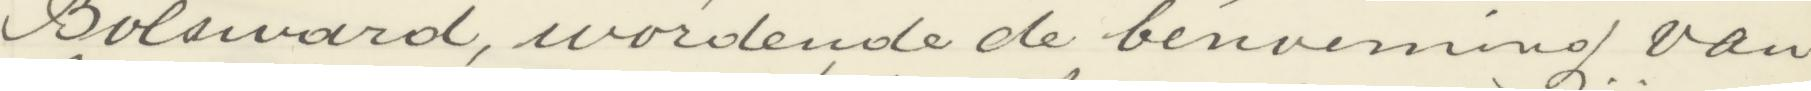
Bolsward, wordende de benoeming van
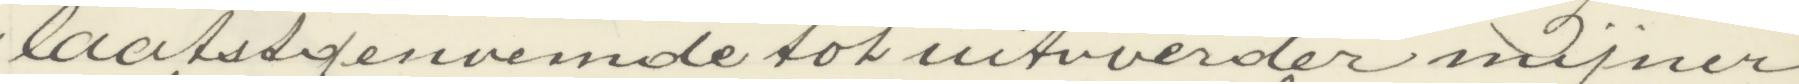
laatstgenoemde tot uitvoerder mijner
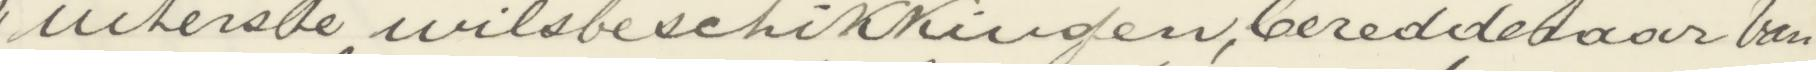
uiterste wilsbeschikkingen, beredderaar van
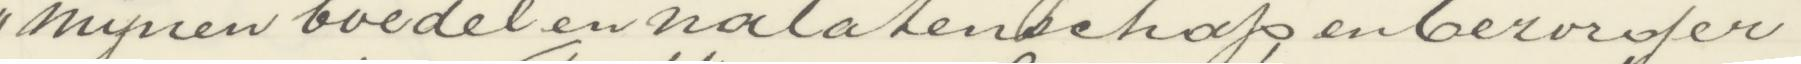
mijnen boedel en nalatenschap en bezorger
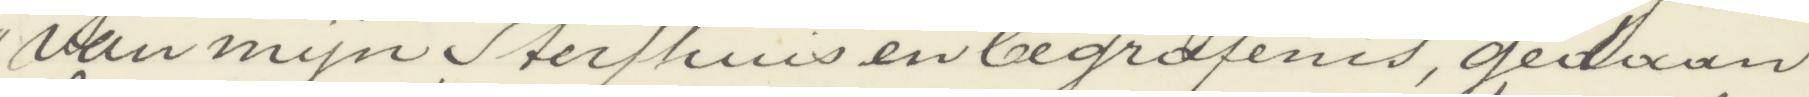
van mijn Sterfhuis en begrafenis, gedaan
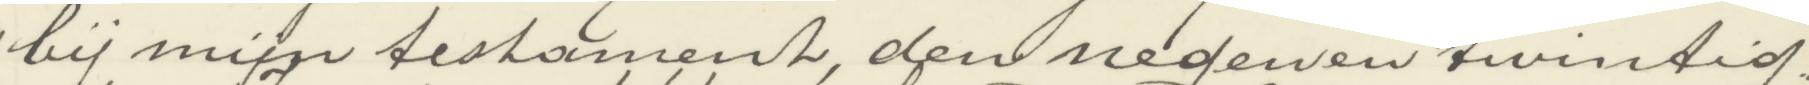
bij mijn testament, den negen en twintig
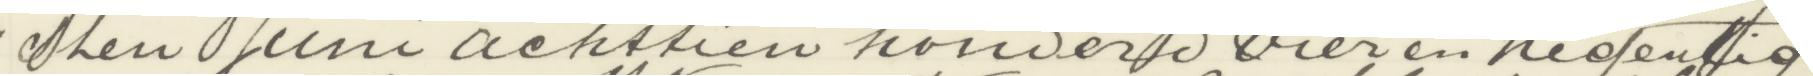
sten Juni achttien honderd vier en negentig
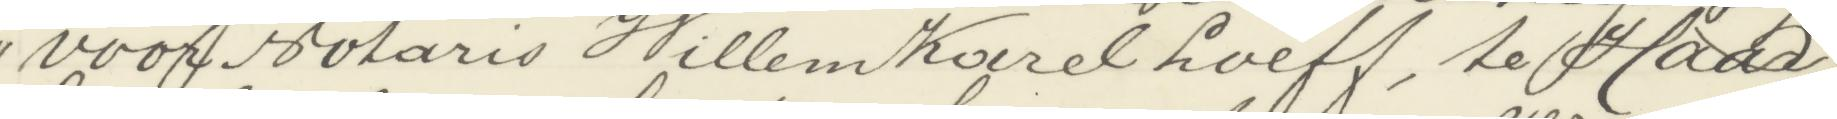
voor Notaris Willem Karel Loeff, te Haar
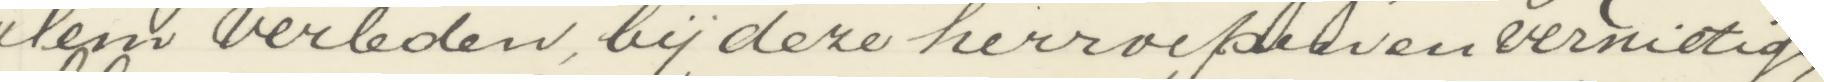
lem verleden, bij deze herroepen en vernietigd,
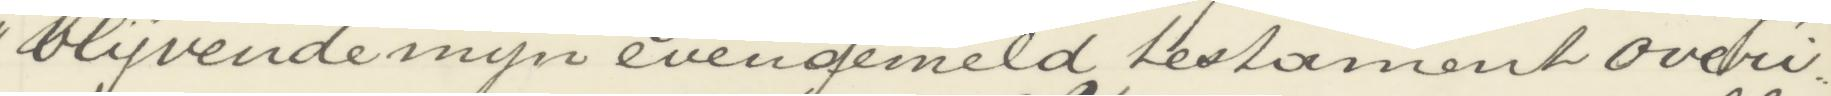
blyvende mijn evengemeld testament overi„
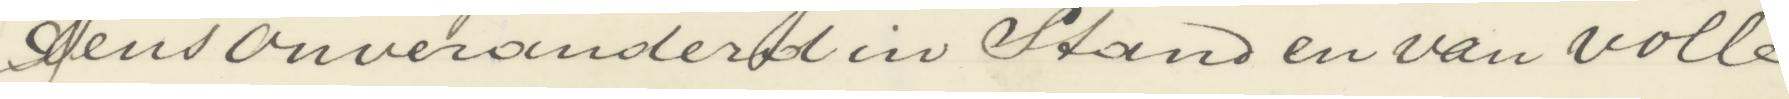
gens onveranderd in stand en van volle
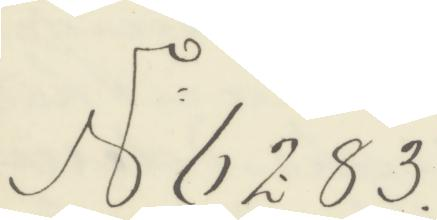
N=o 6283.
